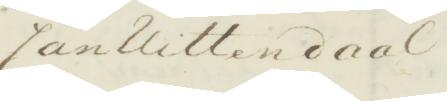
Jan Uittendaal
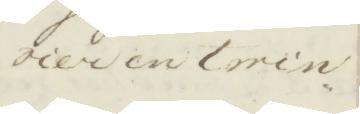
vier en twin„
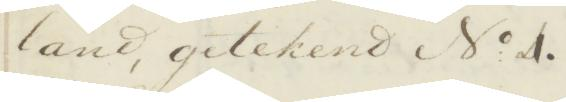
land, getekend N:o 4.
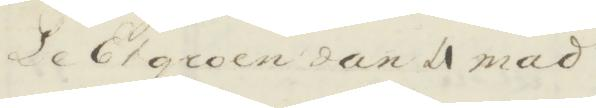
De Etgroen van 4 mad:
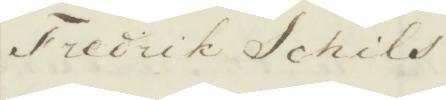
Fredrik Schils
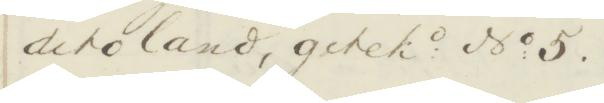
dito land, getek:d N:o 5.
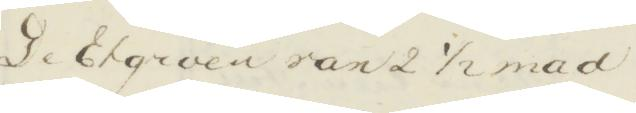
De Etgroen van 2½ mad
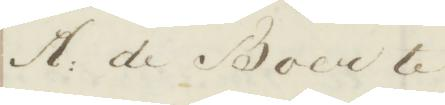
A: de Boer te
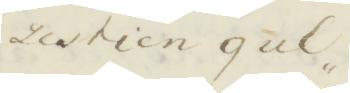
zestien gul„
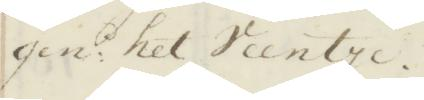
gen: het Veentje.
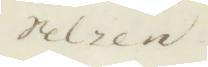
velzen
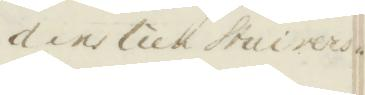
dens tien stuivers
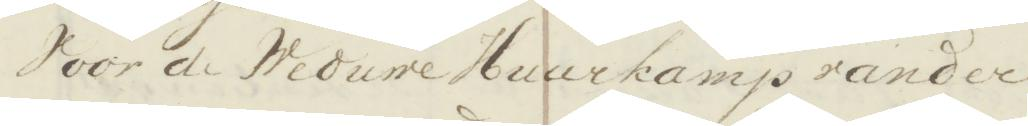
Voor de Weduwe Huurkamp van der
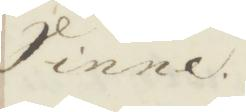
Vinne.
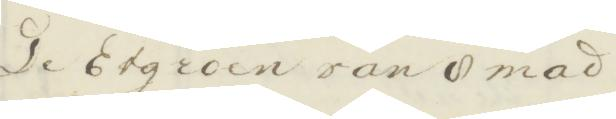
De Etgroen van 8 mad
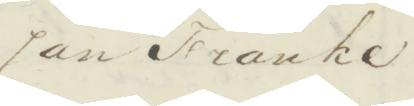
Jan Franke
